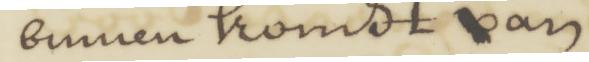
binnen komst van
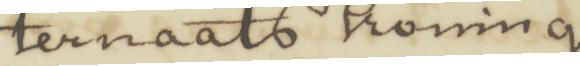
ternaats koningh
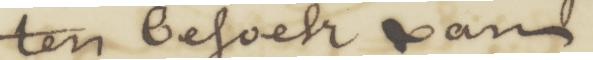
ten besoek van
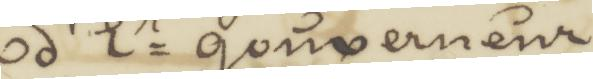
d’ h=r gouverneur
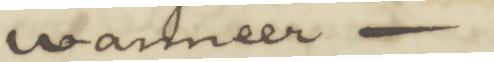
wanneer —
